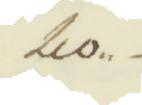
40„
